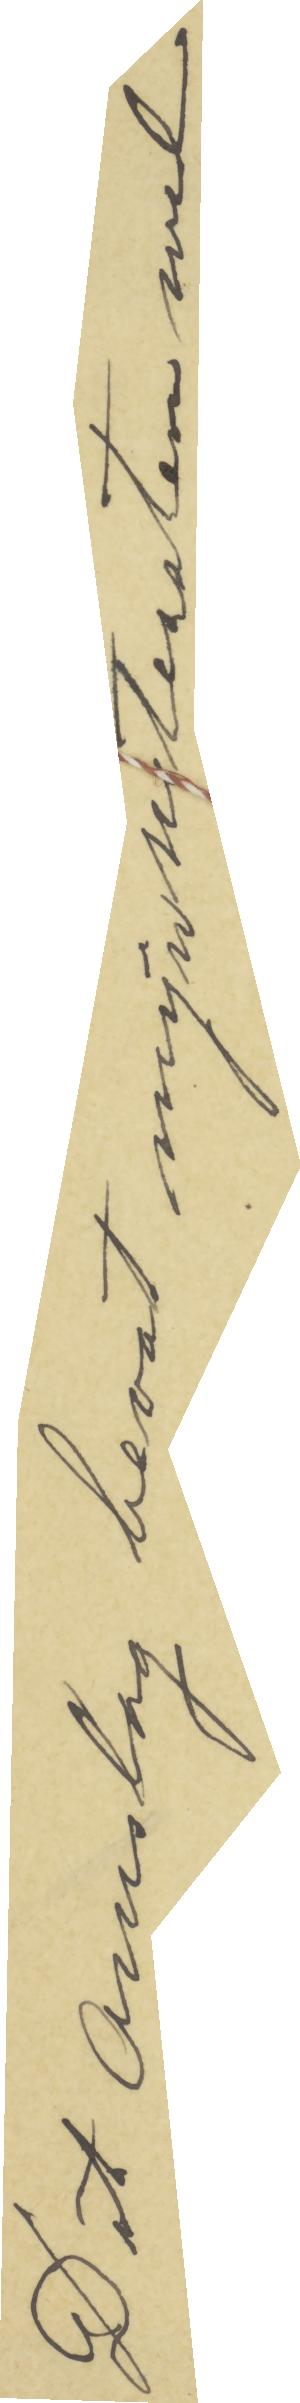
Dit omslag bevat mijn uitersten wil
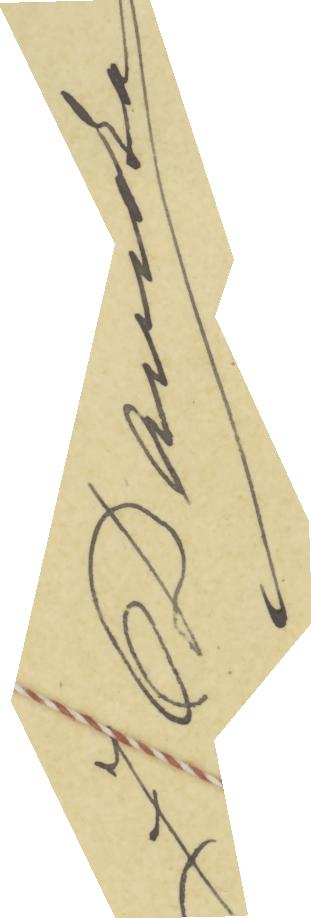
J Davids
